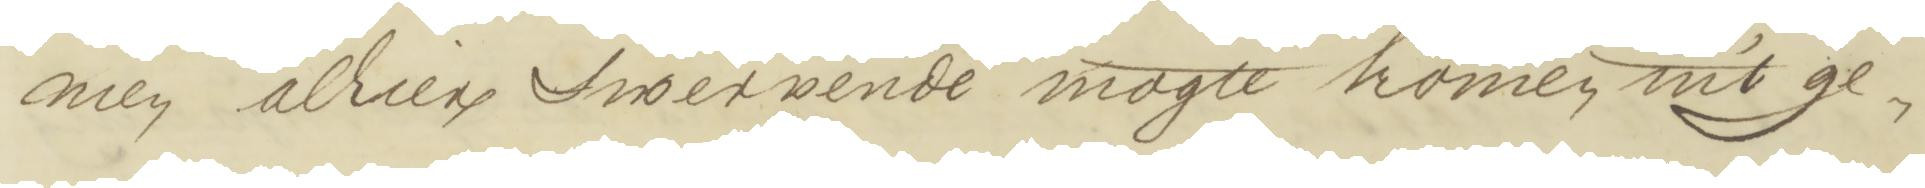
men alhier swervende mogte komen int ge„
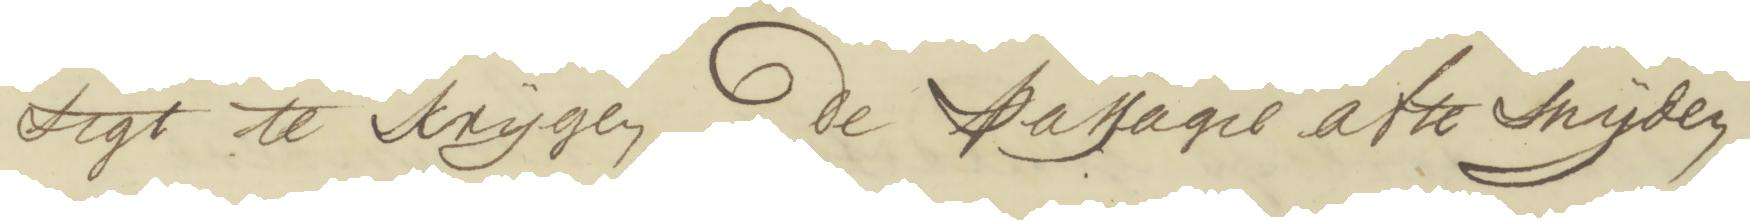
sigt te krijgen, de passagie afte snijden
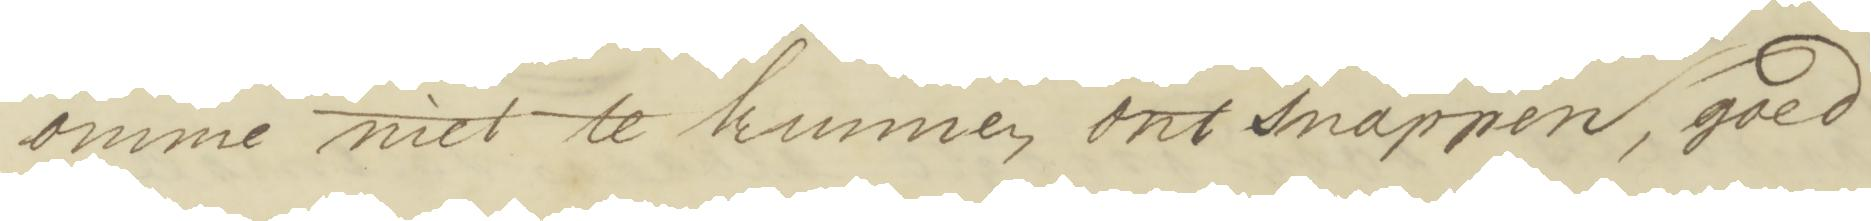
omme niet te kunnen ontsnappen, goed
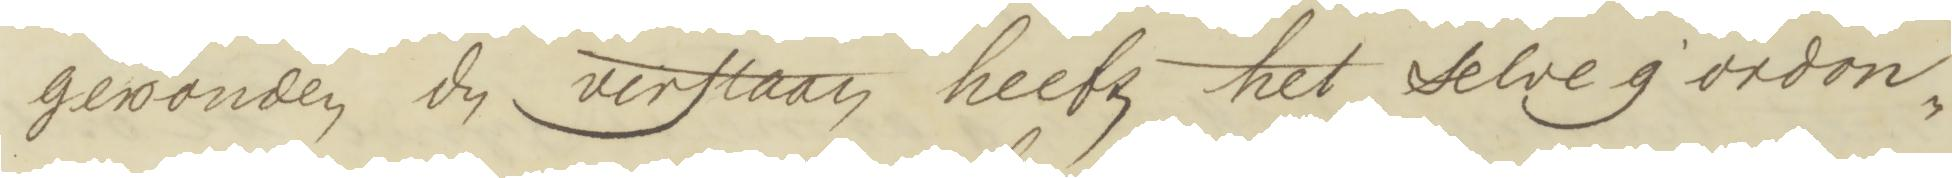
gevonden en verstaan heeft het selve g’ordon„
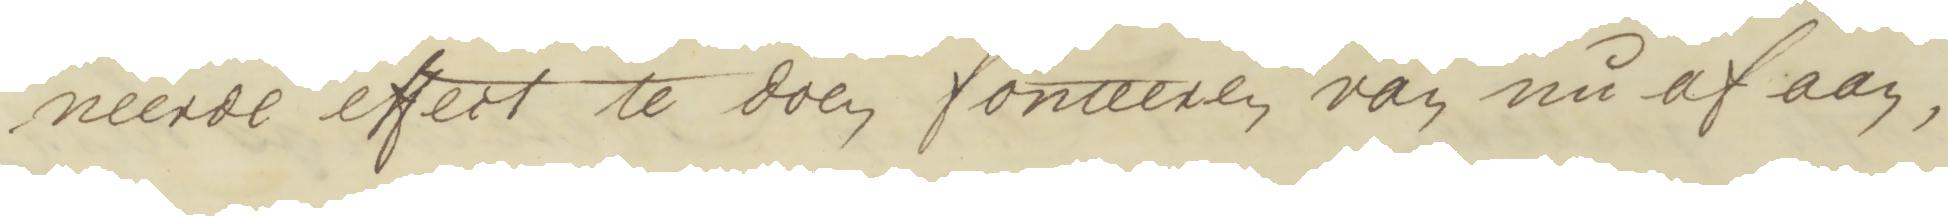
neerde effect te doen fonteeren van nu af aan,
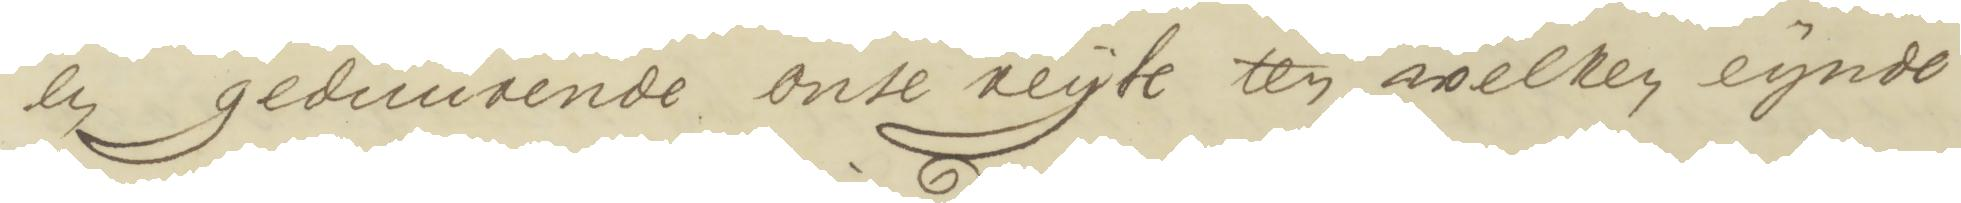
en geduurende onse reijse ten welken eijnde
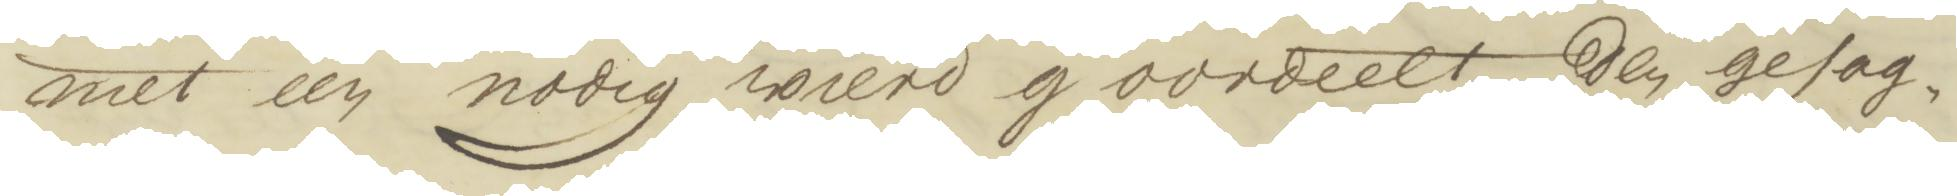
met een nodig wierd g' oordeelt den gesag„
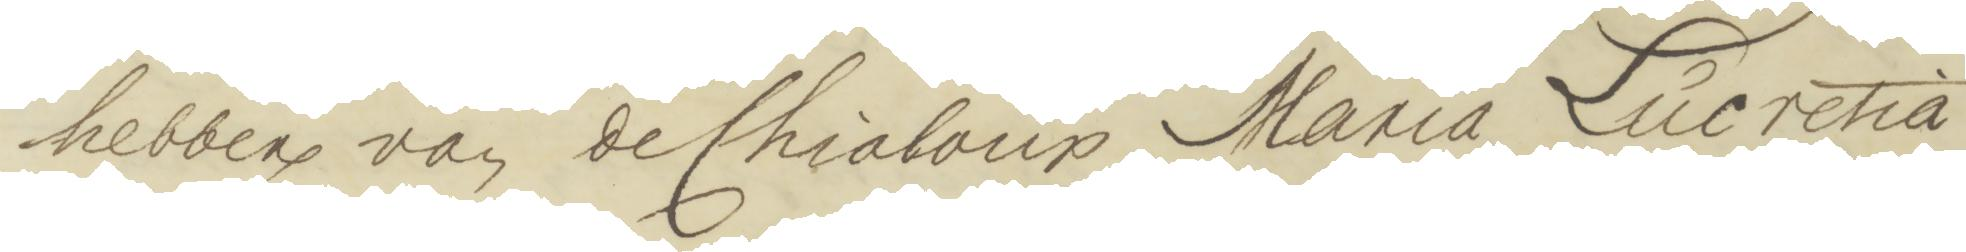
hebber van de Chialoup Maria Lucretia
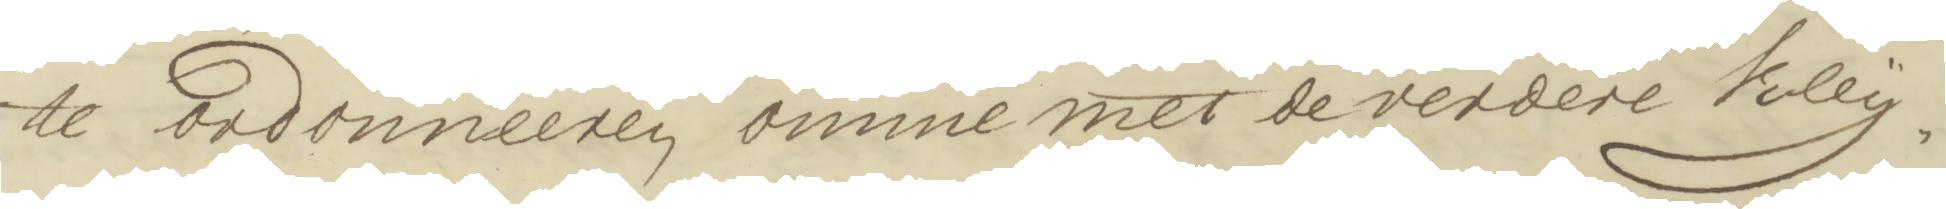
te ordonneeren omme met de verdere kleij„
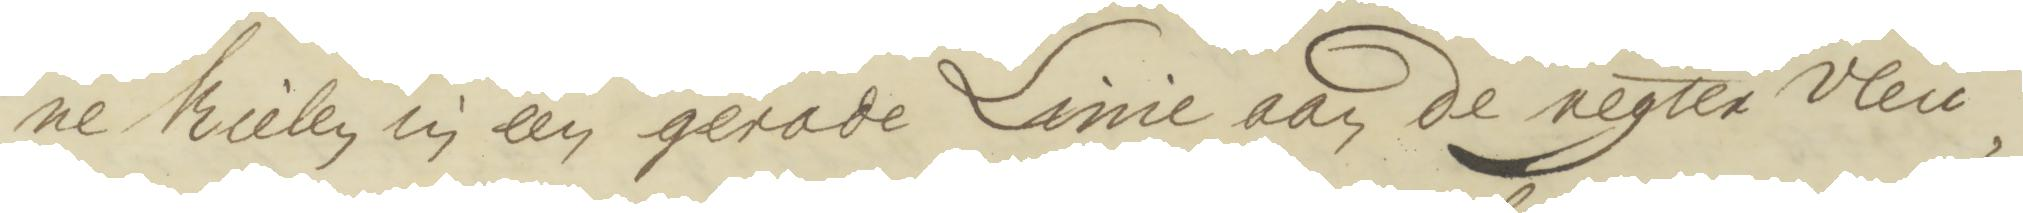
ne kielen in een gerade Linie aan de regter vleu„
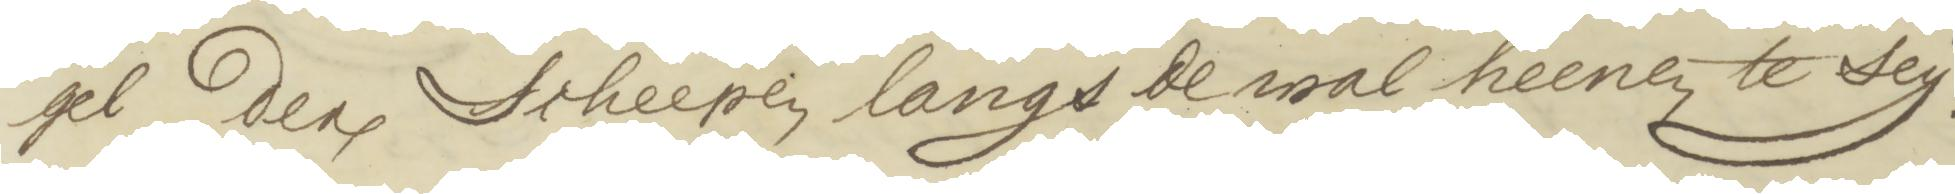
gel der scheepen langs de wal heenen te seij
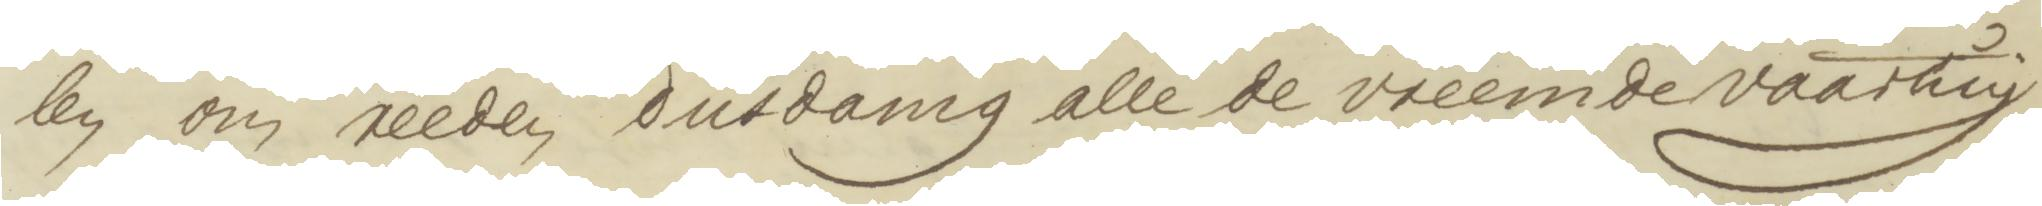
len om reeden dusdanig alle de vreemde vaartuij
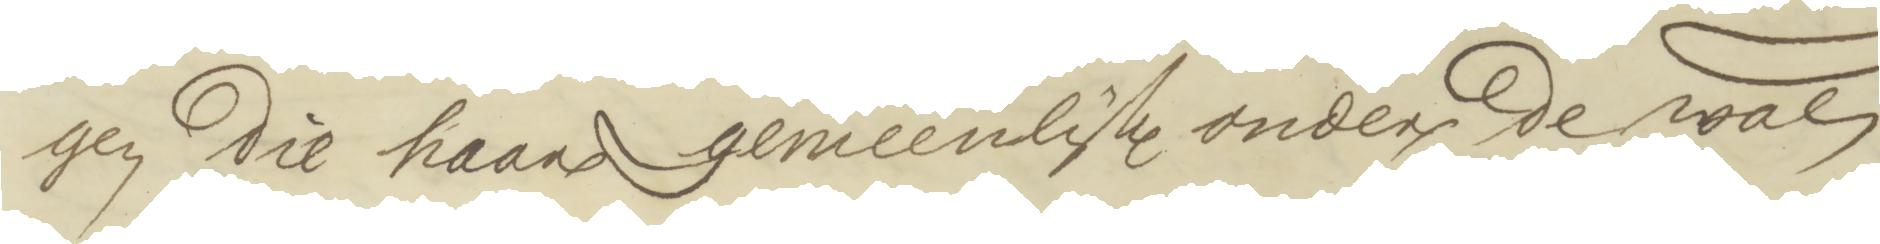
gen die haar gemeenlijk onder de wal
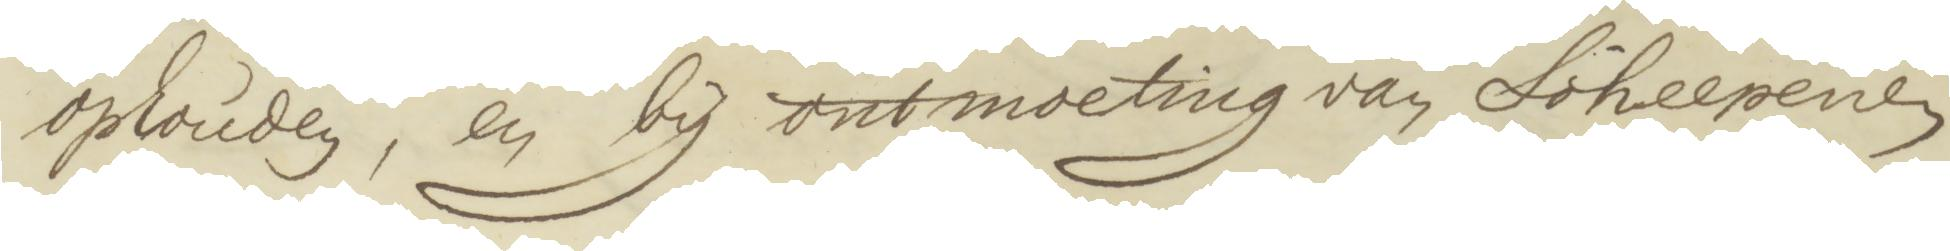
ophouden, en bij ontmoeting van scheepenen
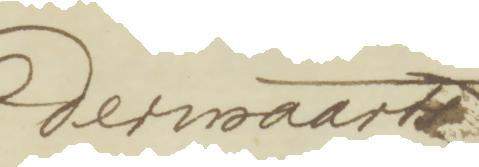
derwaarts
